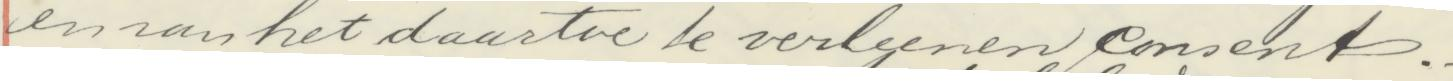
en van het daartoe te verleenen consent.
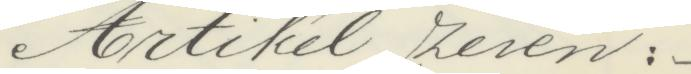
Artikel Zeven:
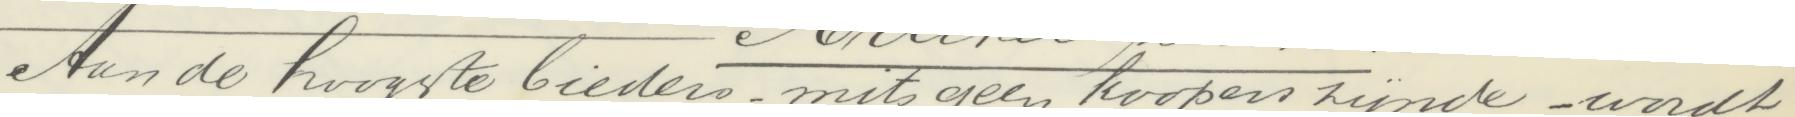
Aan de hoogste bieders - mits koopen zynde - wordt
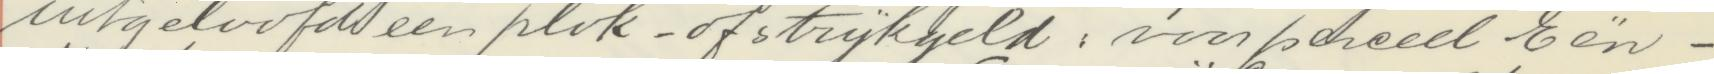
uitgeloofd een plok - of strijkgeld; voor perceel Een-
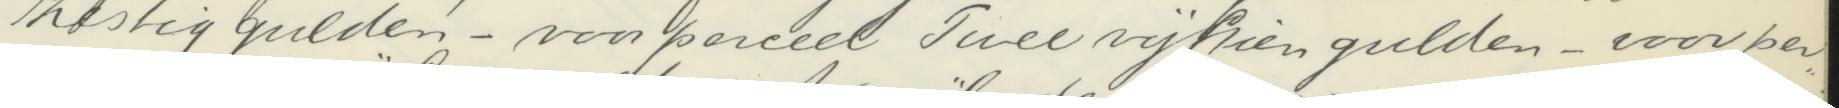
zestig gulden - voor perceel Twee vijftien gulden - voor per„
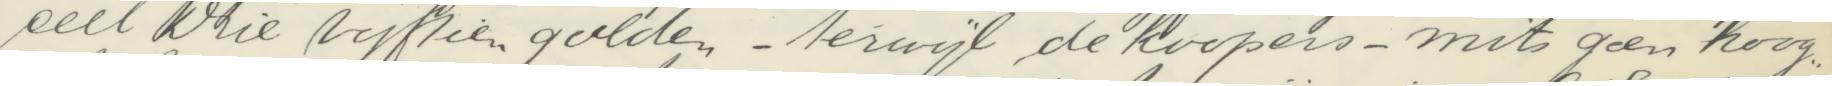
ceel drie vijftien gulden - terwijl, de koopers - mits geen hoog„
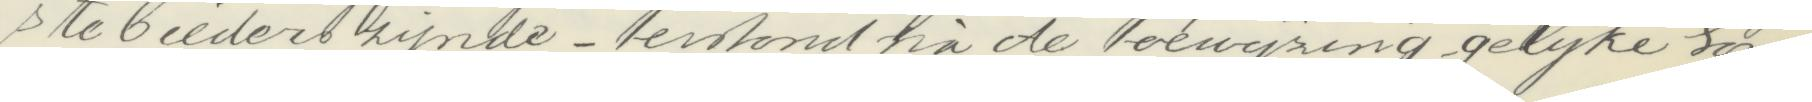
ste bieders zijnde - terstond na de toewijzing gelijke som
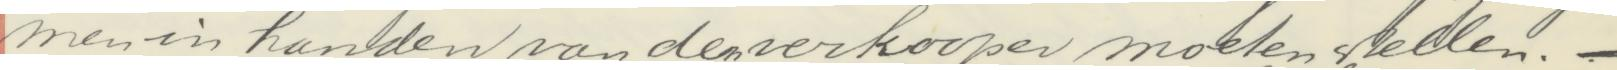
men in handen van den verkooper moeten gellen.-
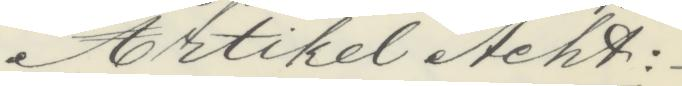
Artikel Acht:
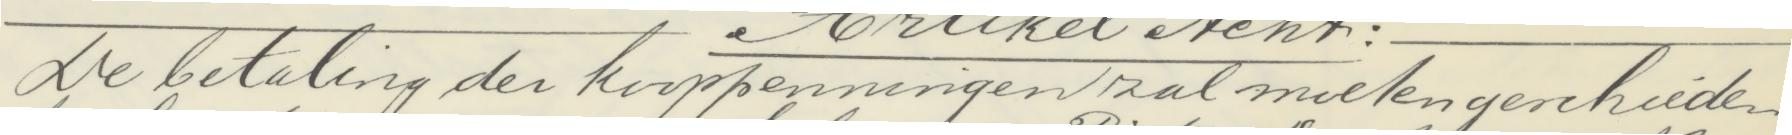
De betaling der kooppenningen zal moeten geschieden
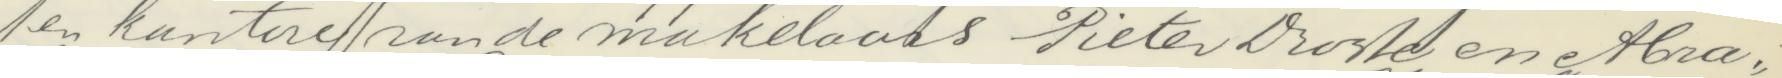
ten kantore van de makelaars Pieter Droste en Abra„
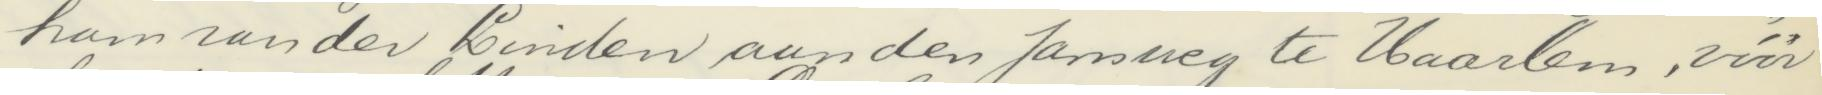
ham van der Linden, aan den Jansweg te Haarlem, vóór
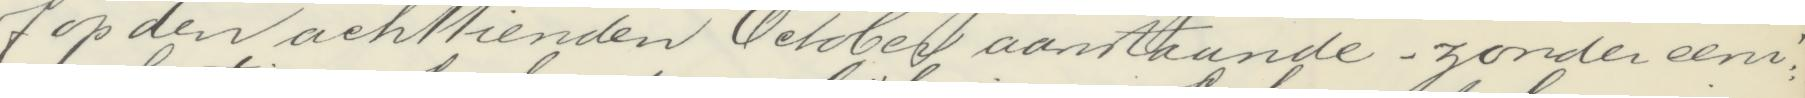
of op den achttienden October aanstaande - zonder eeni„
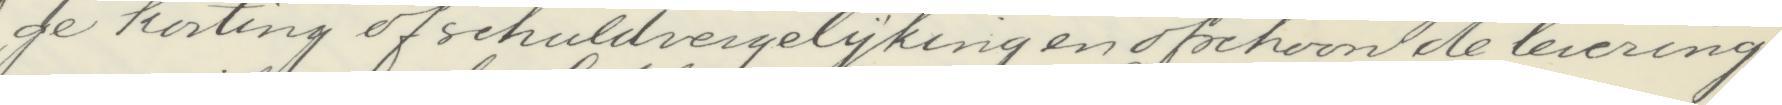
ge korting of schuldvergelijking en ofschoon de levering
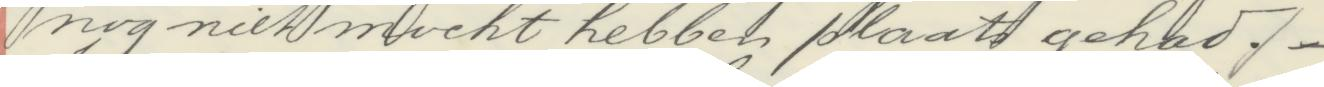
/nog niet mocht hebben plaats gehad./-
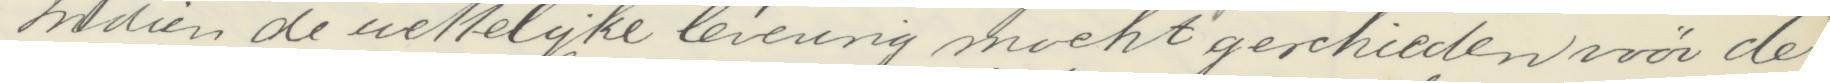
Indien de wettelijke leveing mocht geschieden vóór de
